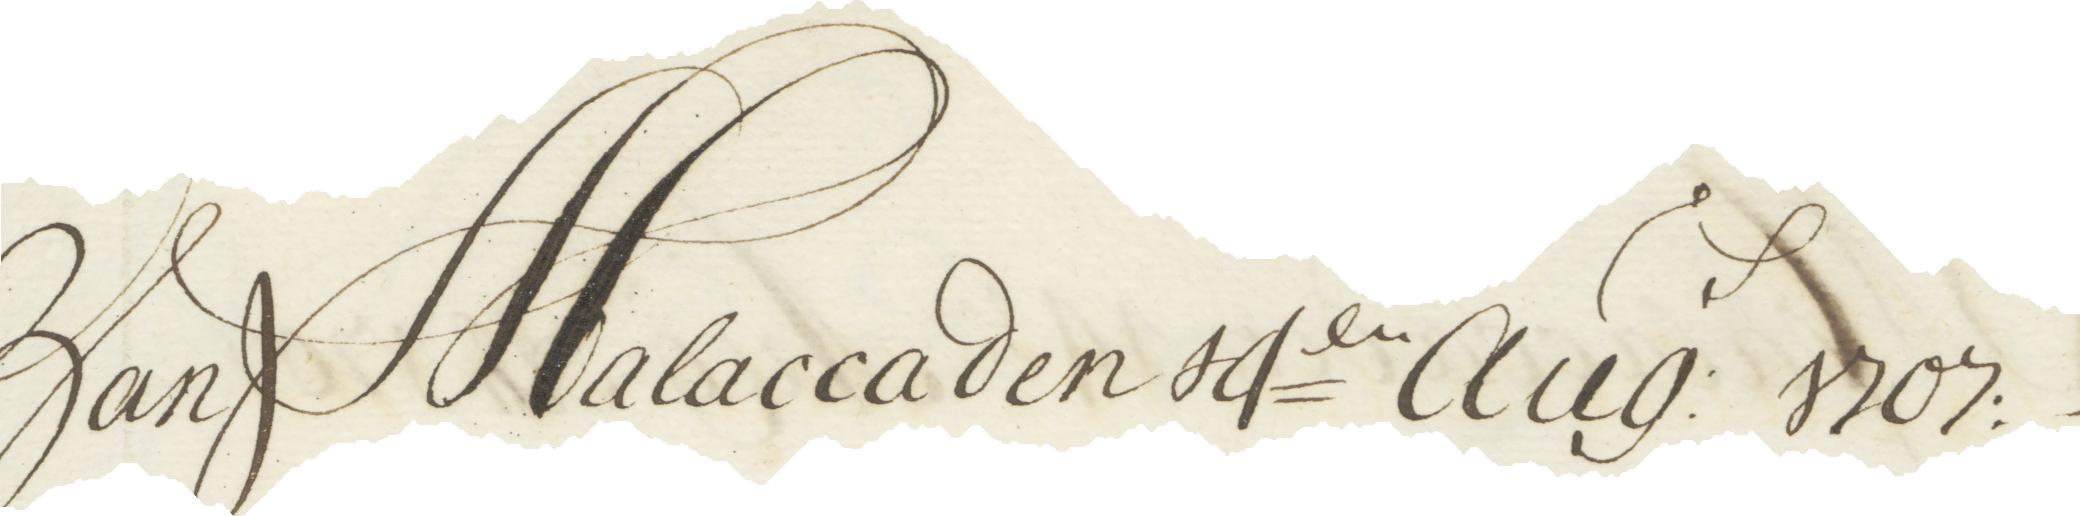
Van Malacca den 14=en Aug:s 1707: —
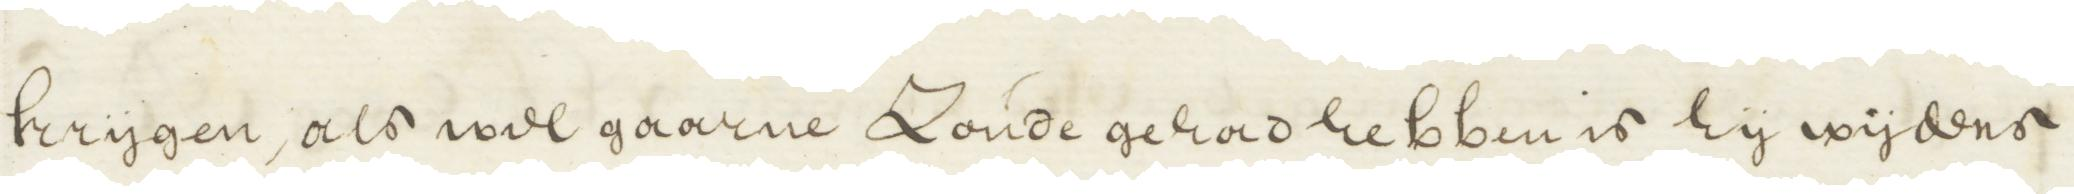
krijgen, als wel gaarne zoude gehad hebben is hij wijders
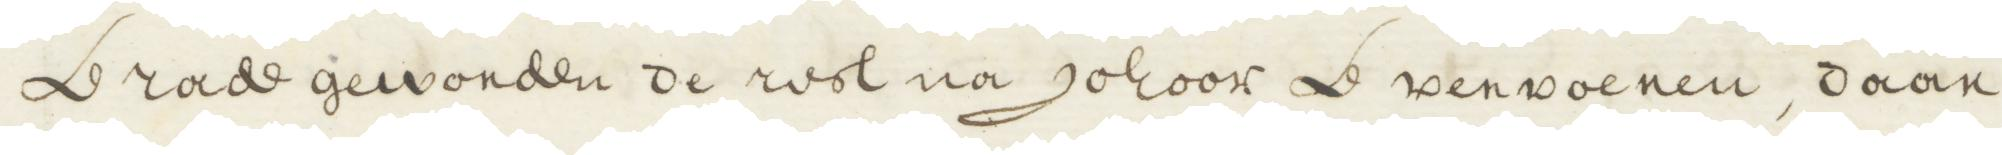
te rade geworden de rest na johoor te vervoeren, daar
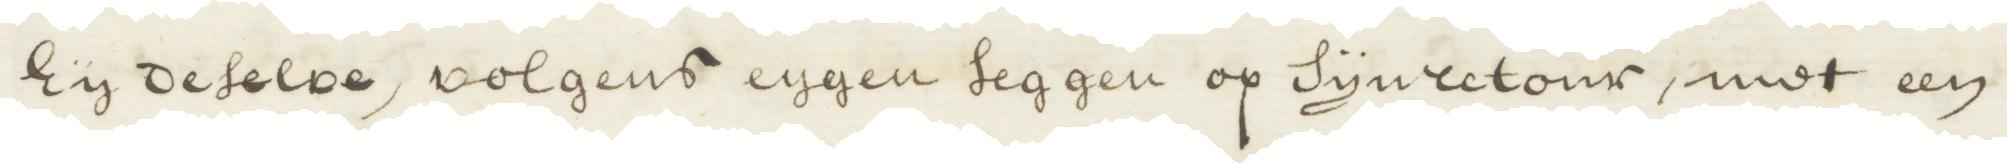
hij deselve, volgens eygen seggen op sijn retour, met een
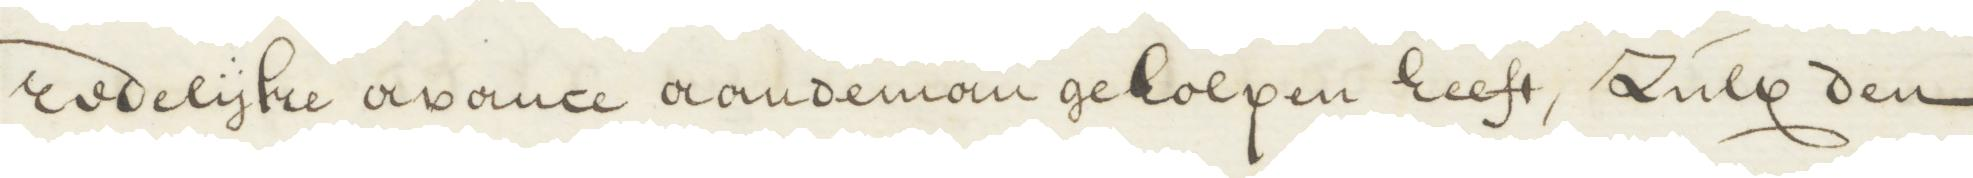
redelijke avance aan deman geholpen heeft, zulx den
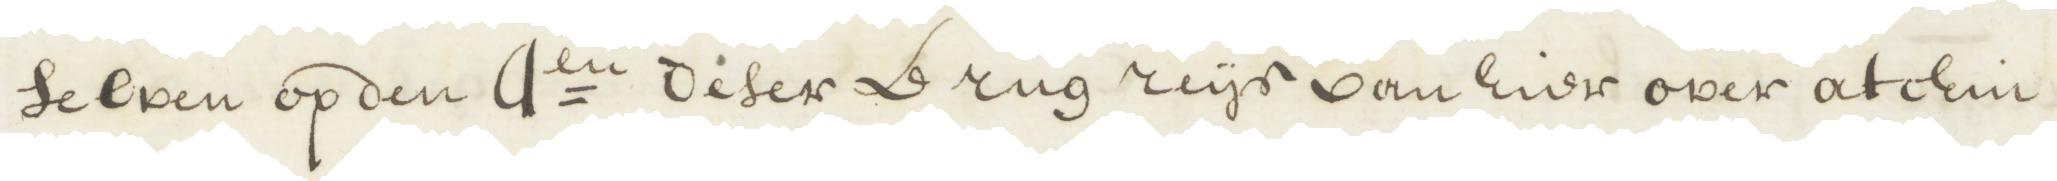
selven op den 4=en deser te rug reijs van hier over atchin
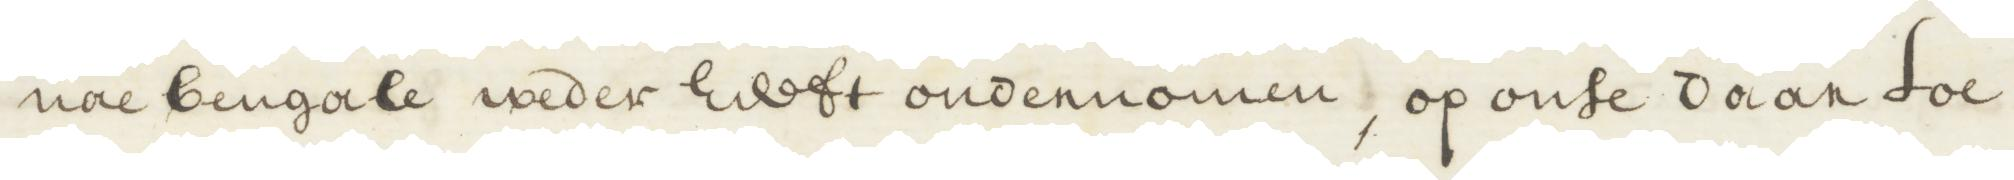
nae bengale weder heeft ondernomen, op onse daar toe
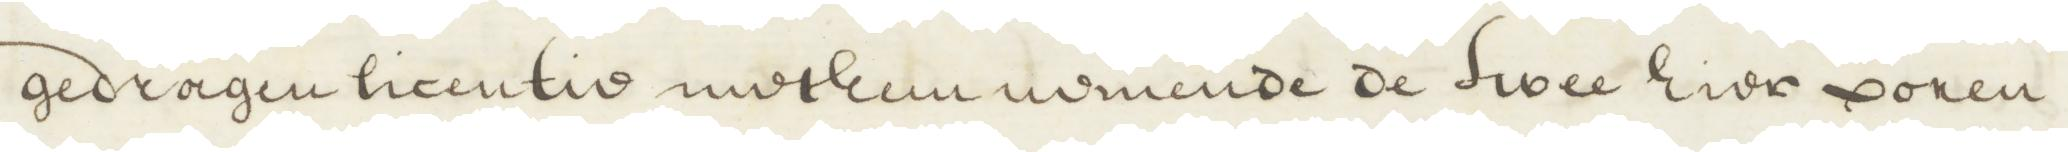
gedragen licentie met hem nemende de twee hier voren
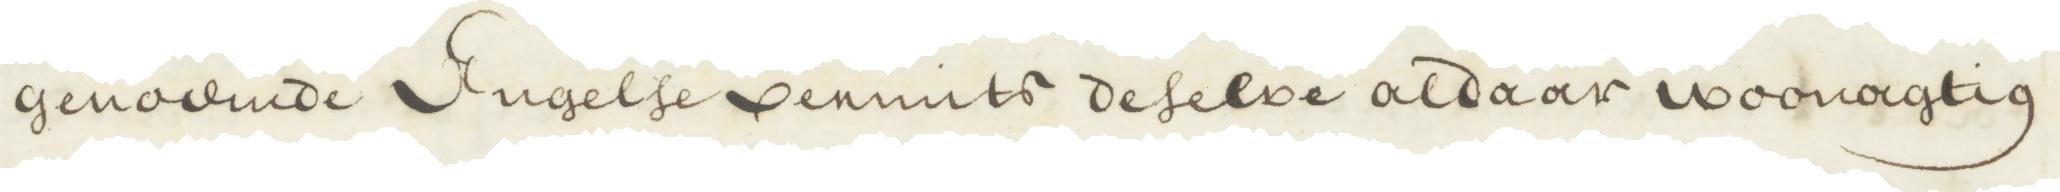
genoemde Engelse vermits deselve aldaar woonagtig
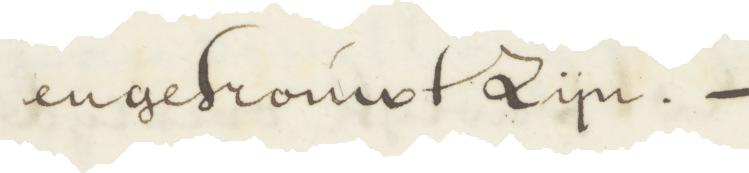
en getrouwt zijn. —
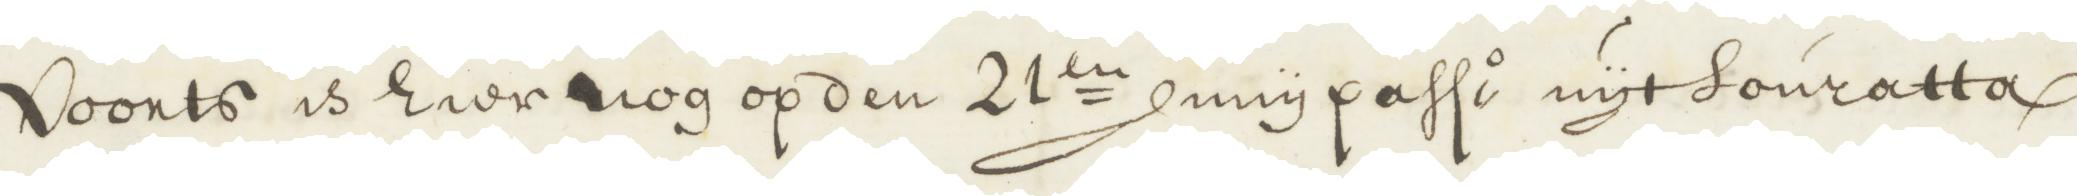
Voorts is hier nog op den 21=en junij pass„o uijt souratta
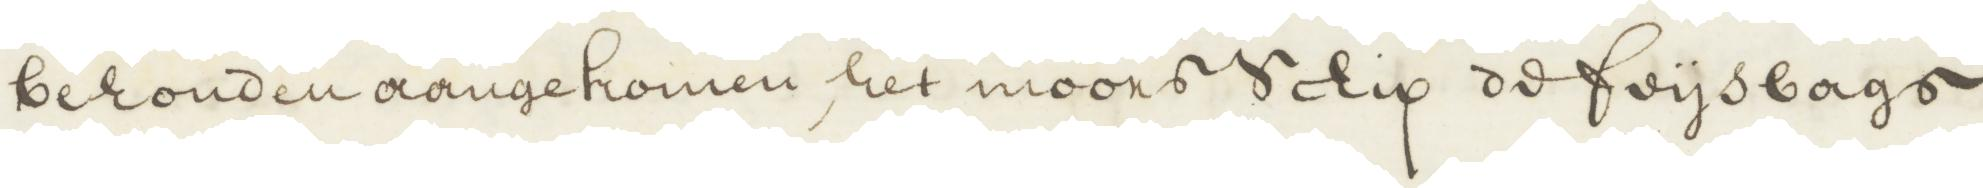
behouden aangekomen, het moors schip de feijsbags
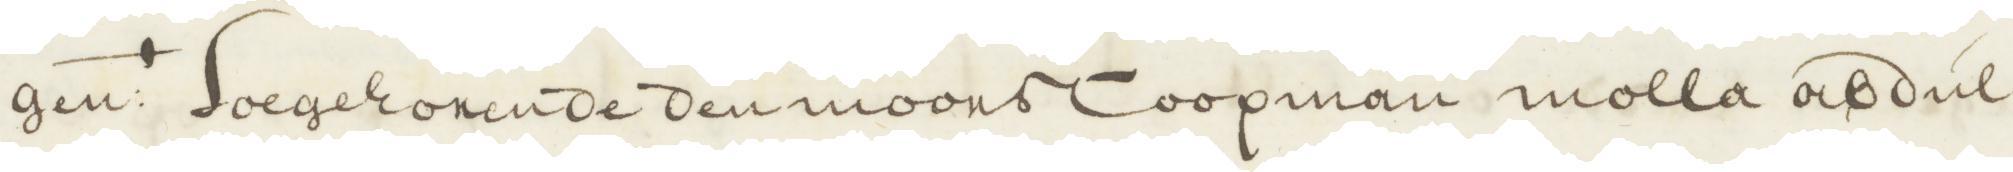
gen:t toegehorende den moors Coopman molla abdul
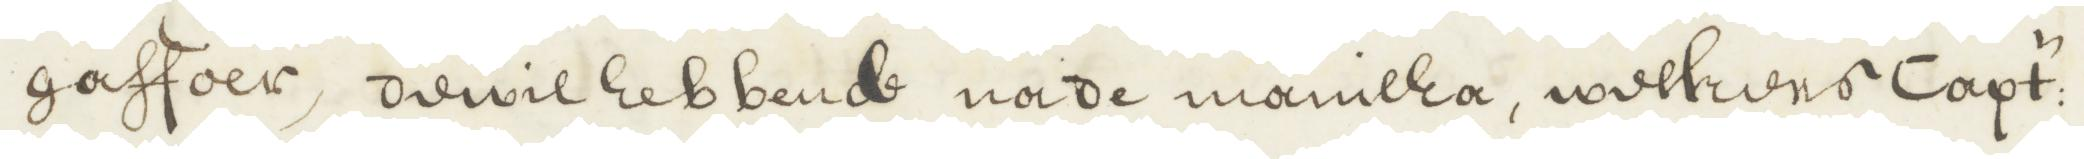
gaffoer, dewil hebbende na de manilha, welkers Capt:n
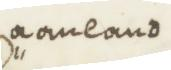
aanland
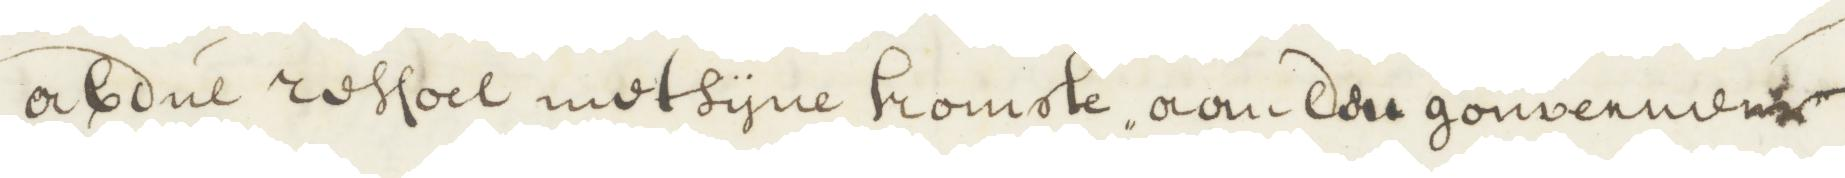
abdul ressoel met sijne komste „ aan den gouverneur
